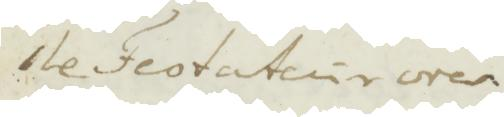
de Testateur over
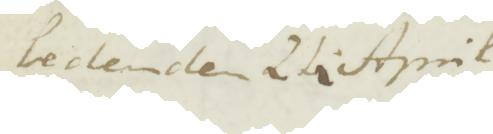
leden den 24 April
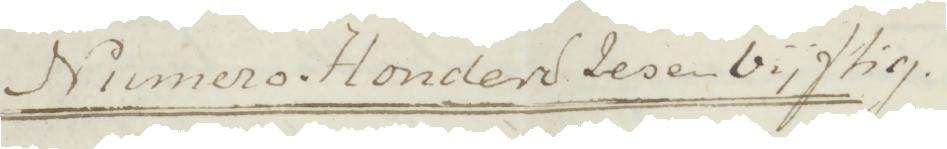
Numero. Honderd zes en vijftig.
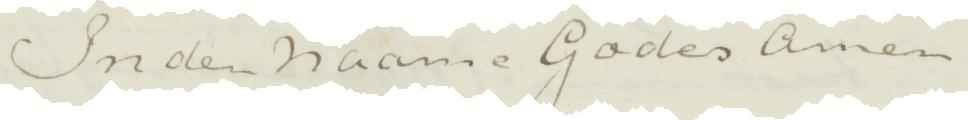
Jn den naame Godes amen!
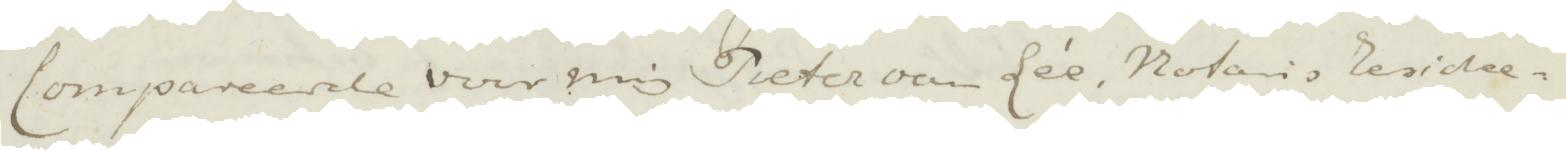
Compareerde voor mij Pieter van Leé, Notaris residee=
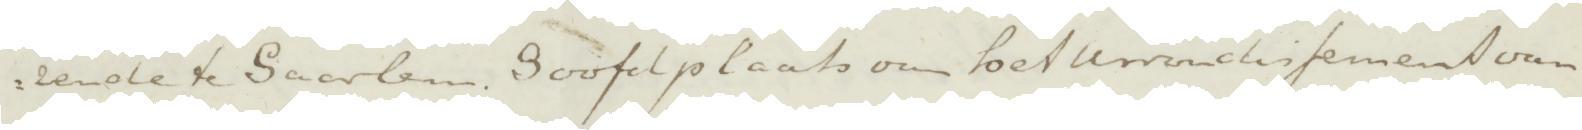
=rende te Haarlem, Hoofdplaats van het arrondissement van
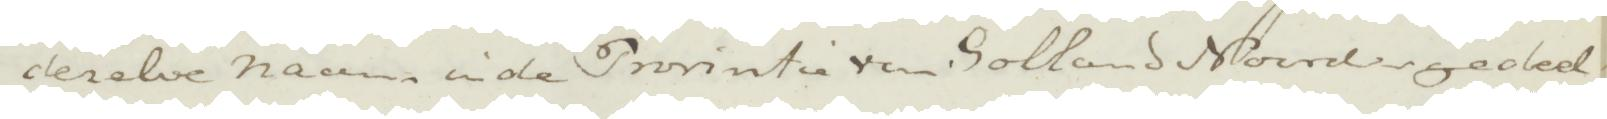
dezelve naam in de Provintie van Holland Noordergedeel
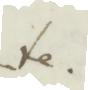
te.
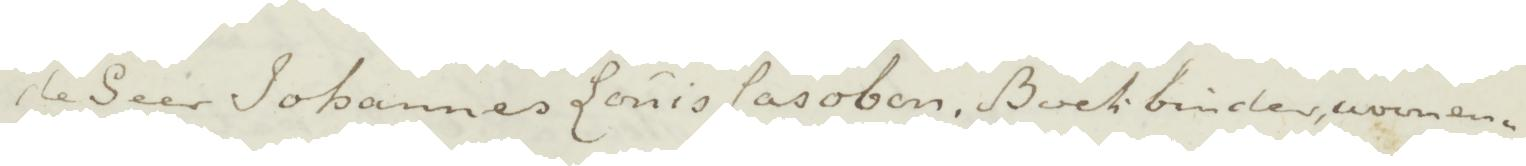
de Heer Johannes Louis Casobon, Boekbinder, woonen„
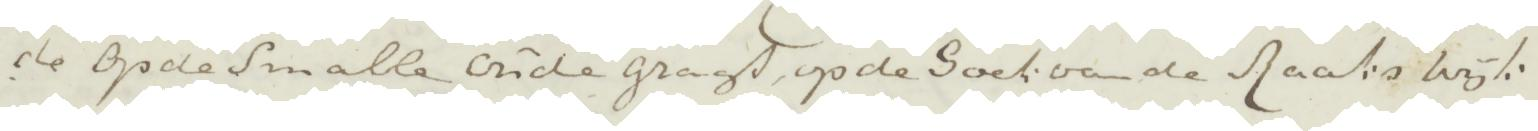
de op de smalle oude gragt, op de hoek van de Raaks wijk
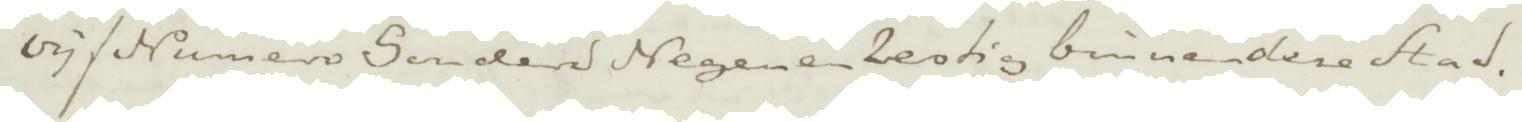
vijf Numero Honderd Negen en zestig binnen deze stad.
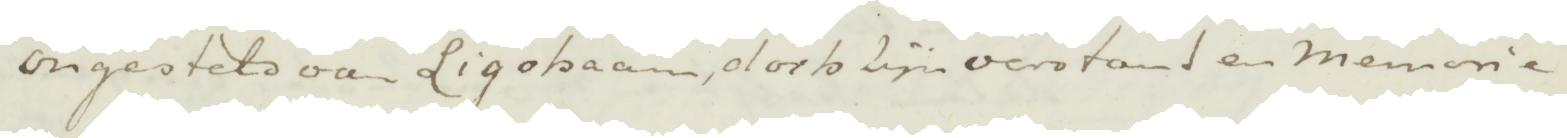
ongesteld van Ligchaam, doch zijn verstant en memorie
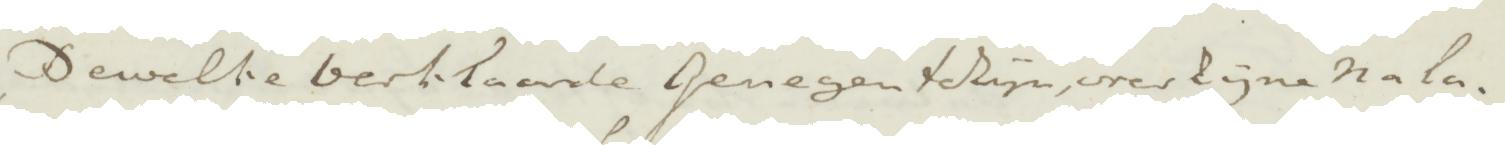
Dewelke verklaarde genegen te zijn, over zijne nala,
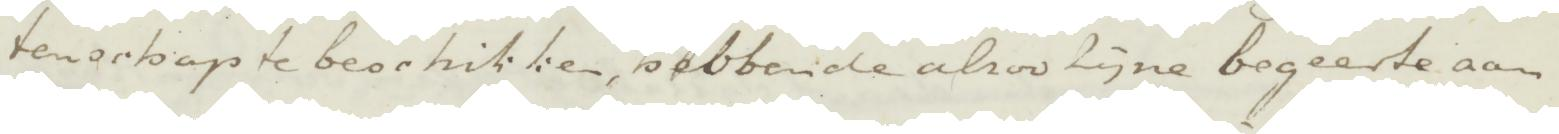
tenschap te beschikken, hebbende alzoo zijne begeerte aan
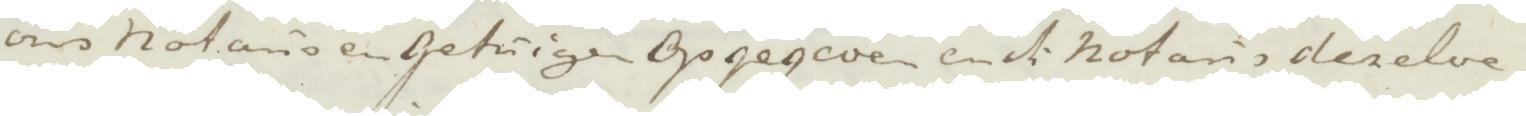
ons Notaris en Getuigen opgegeven en ik Notaris dezelve
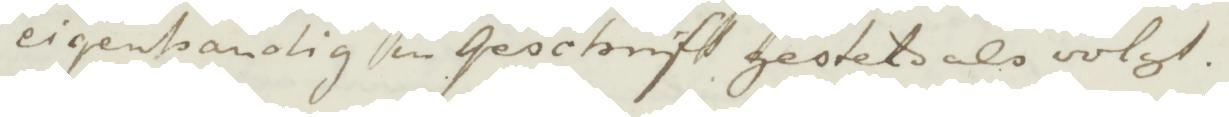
eigenhandig in geschrift gesteld als volgt.
